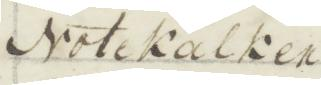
Notekalker
